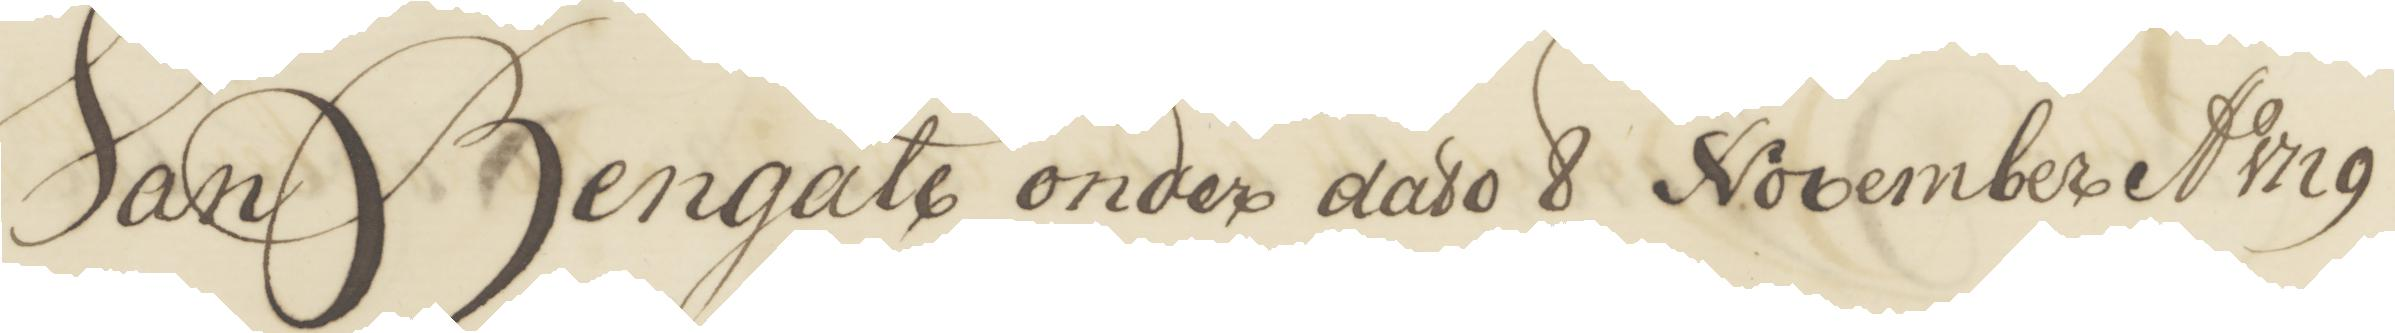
Van Bengale onder dato 8 November Ao 1729
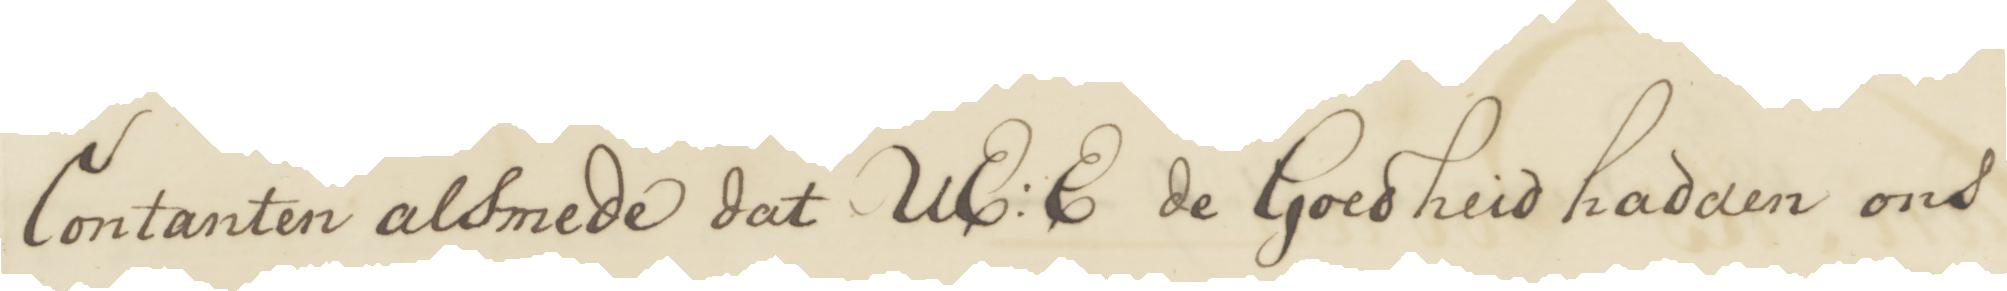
Contanten alsmede dat UE: E de Goedheid hadden ons
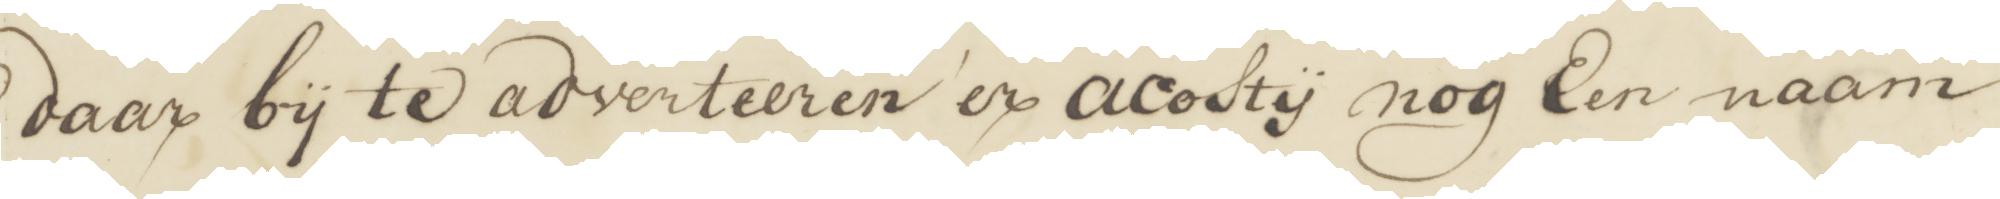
daar bij te adverteeren 'er acostij nog Een naam
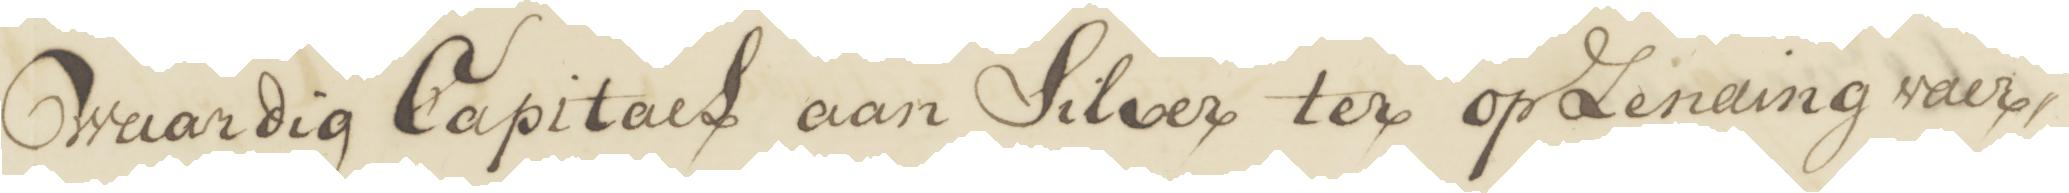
waardig Capitael aan Silver ter opzending vaer„
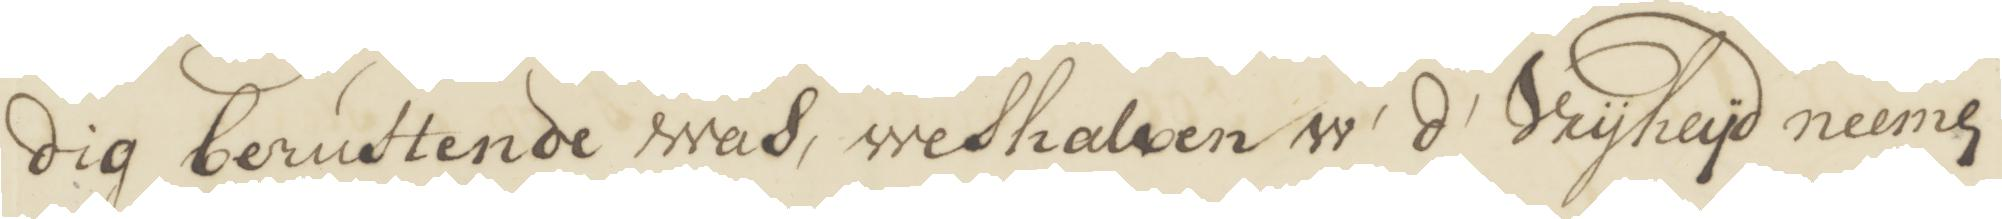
dig berustende was, weshalven w' d' Vrijheijd neemen
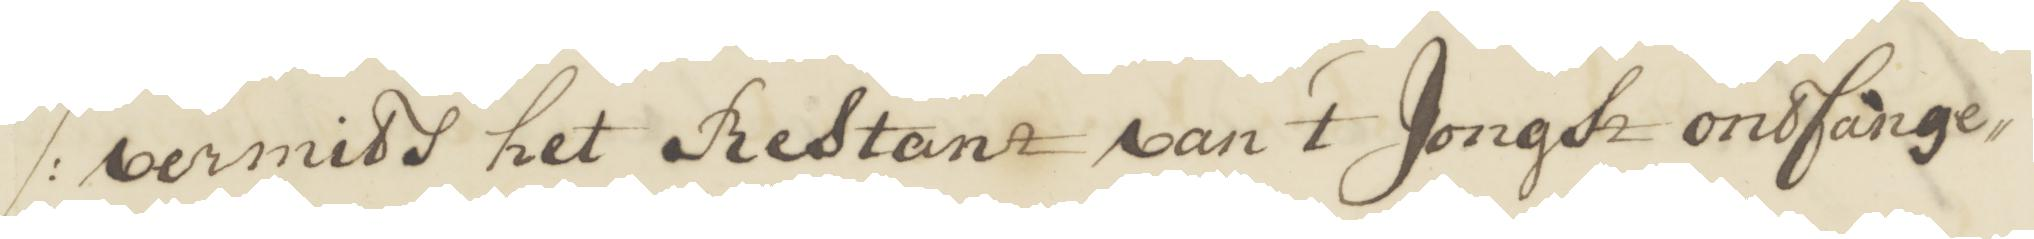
/: vermits het Restant van ’t Jongst ontfange„
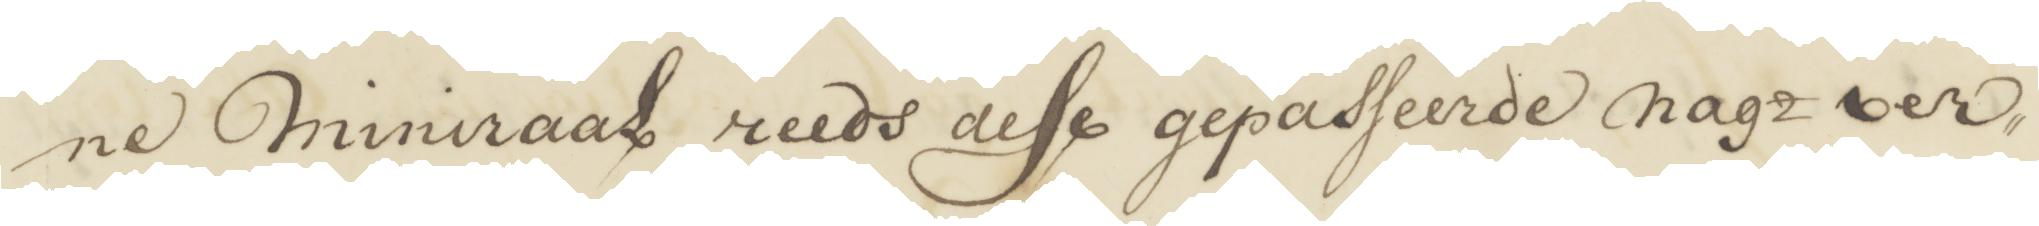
ne miniraal reeds dese gepasseerde nagt ver„
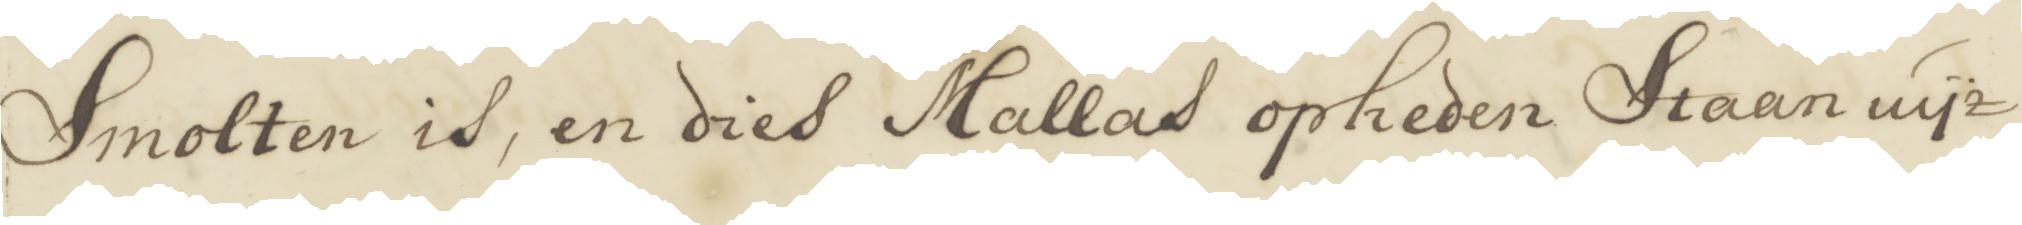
Smolten is, en dies Mallas op heden Staan uijt
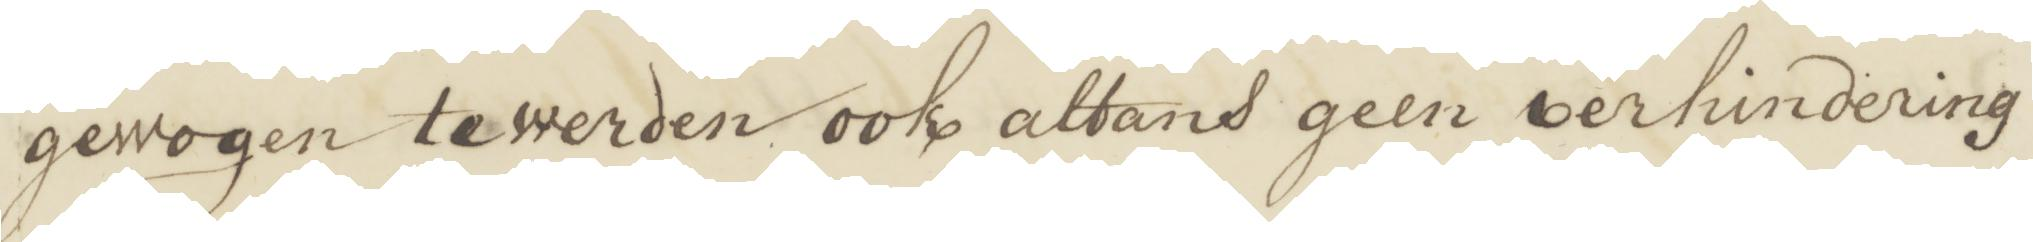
gewogen te werden ook altans geen verhindering
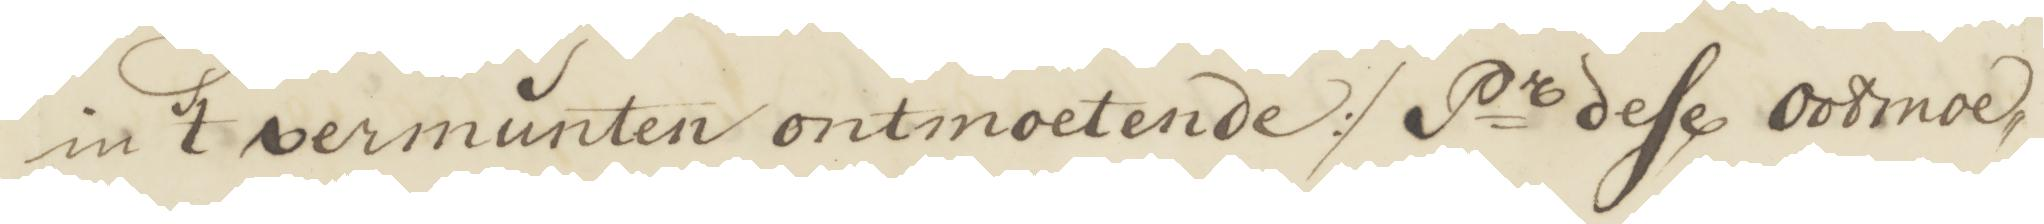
in ’t vermunten ontmoetende :/ P=r dese ootmoe„
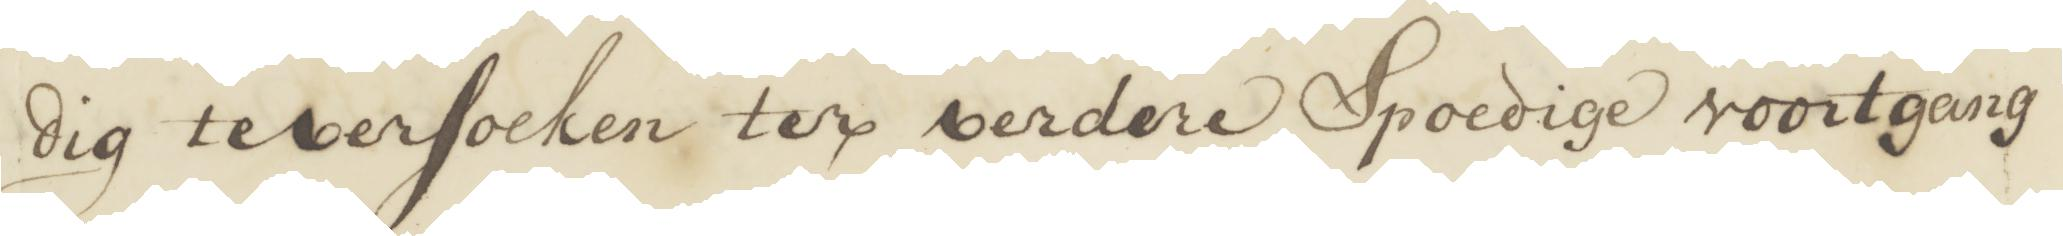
dig te versoeken ter verdere spoedige voortgang
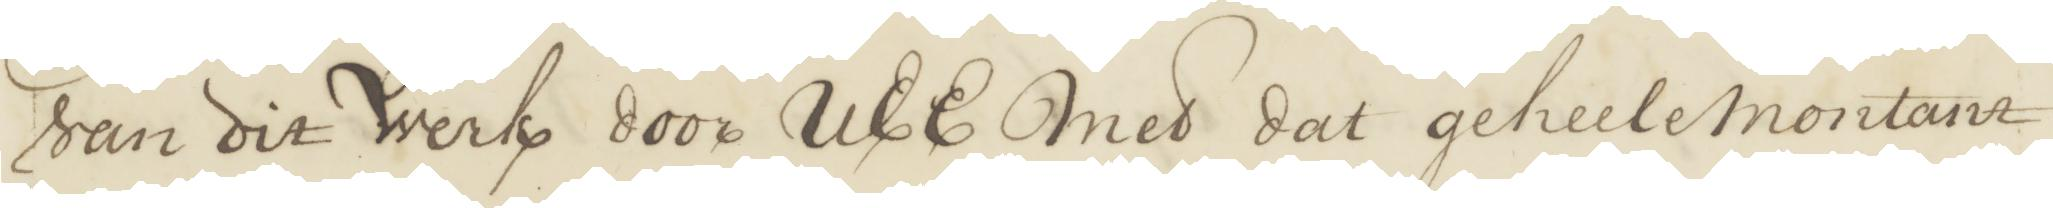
van dit werk door UEE met dat geheele montant
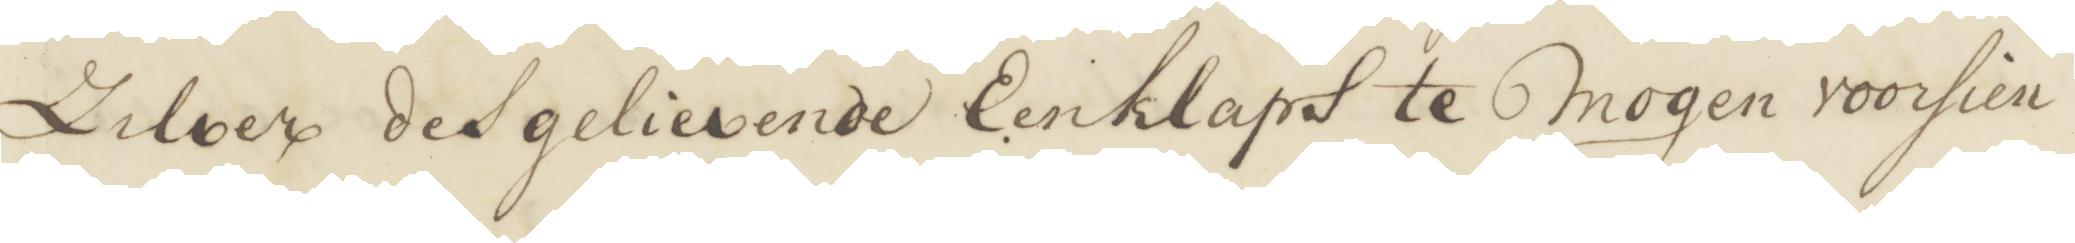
zilver des gelievende Eenklaps te mogen voorsien
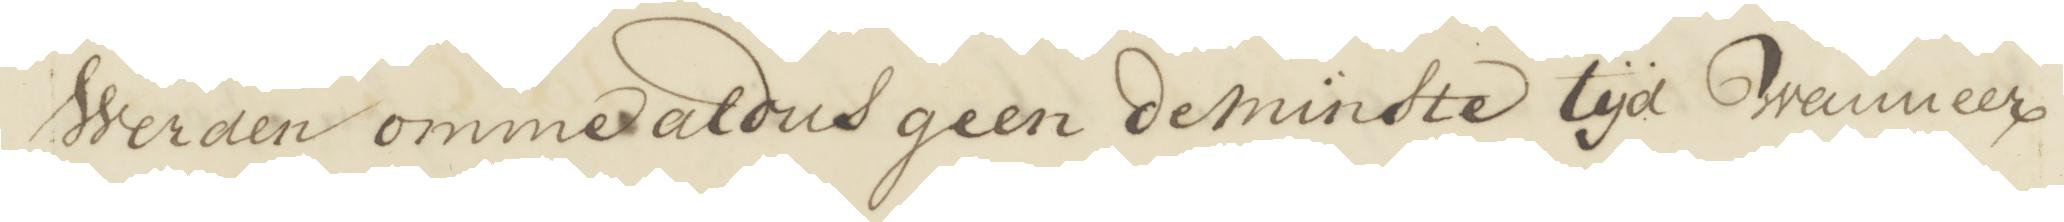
werden omme aldus geen de minste tijd wanneer
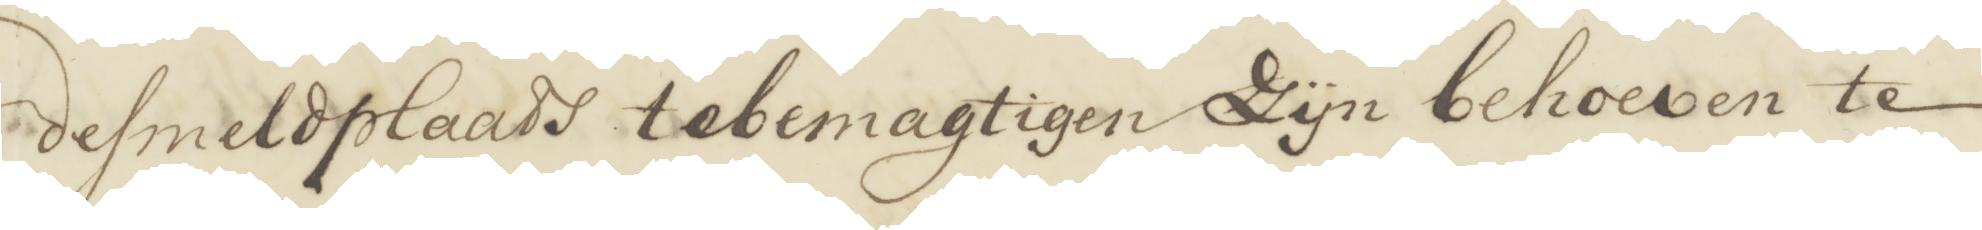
desmeldplaats tebemagtigen zijn behoeven te
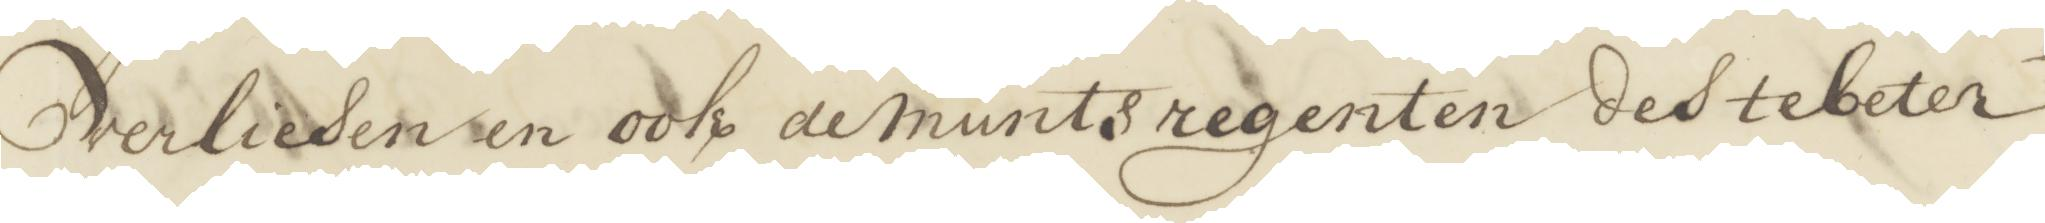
verliesen en ook de munts regenten des te beter
